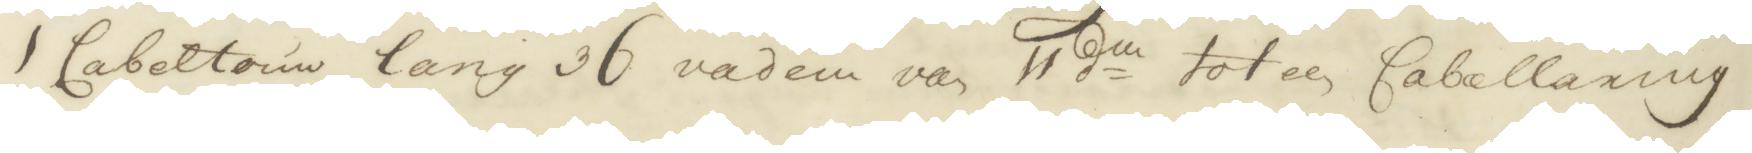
1 Cabeltouw lang 36 vadem van 11 d=m tot een Cabellaring
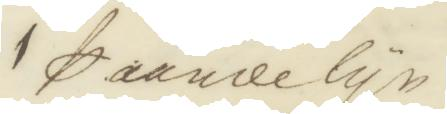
1 paarde lijn
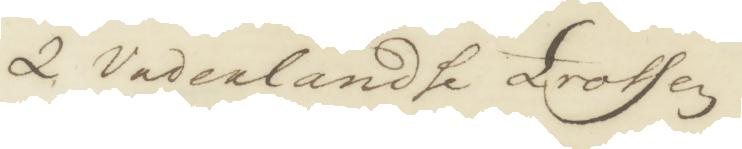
2 vaderlandse trossen
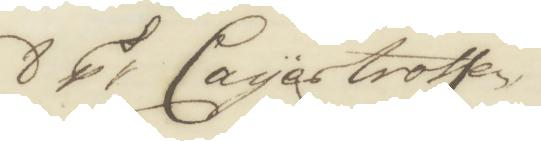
8 p„s Caijestrossen
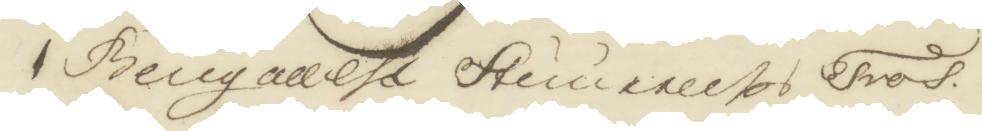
1 Bengaalse Stuurreeps Tros.
